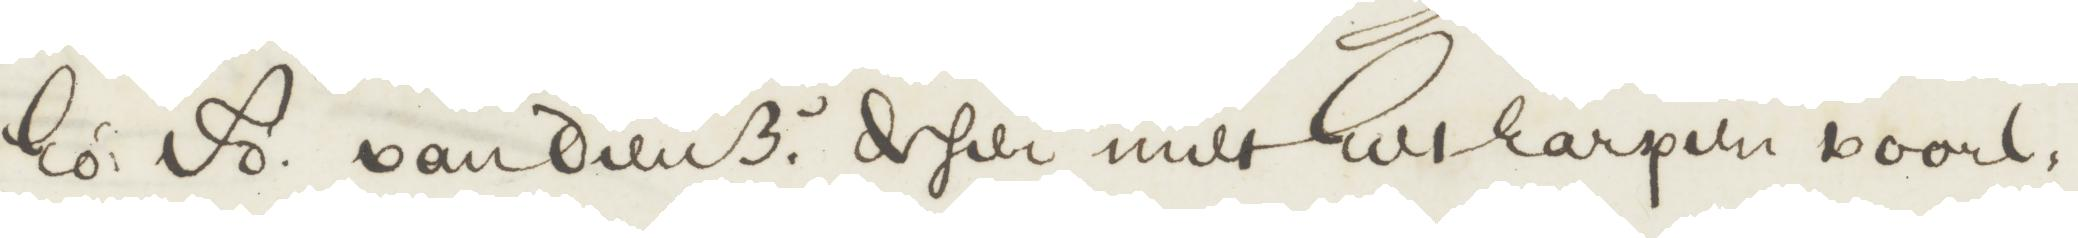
ho: Ed: van den 3.e deser met het harpen voort„
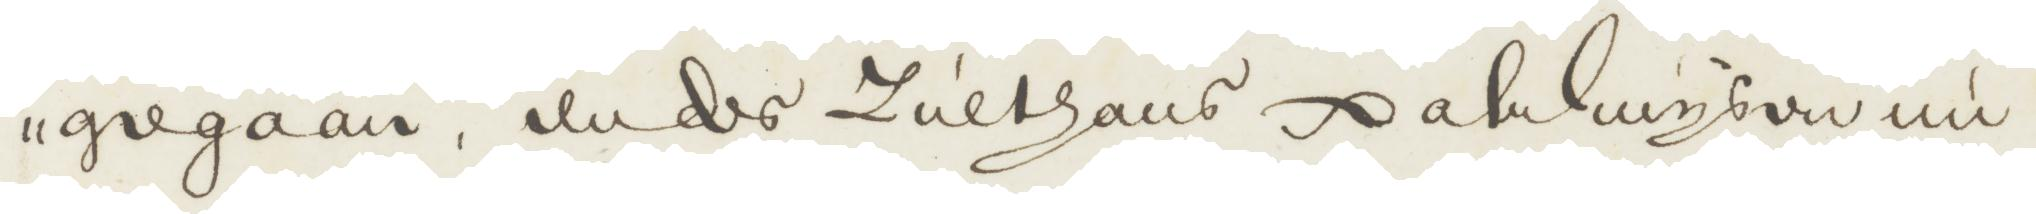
„gegaan, en des zulthans pakhuijsen nu
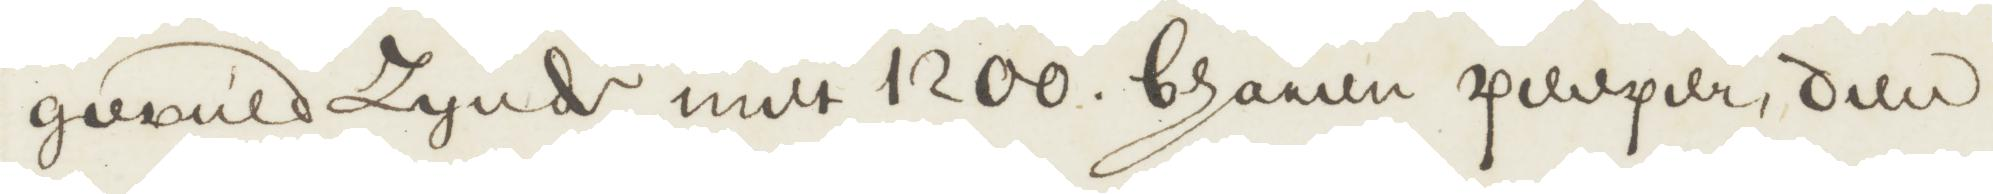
gevuld zijnde met 1200. bharen peeper, den
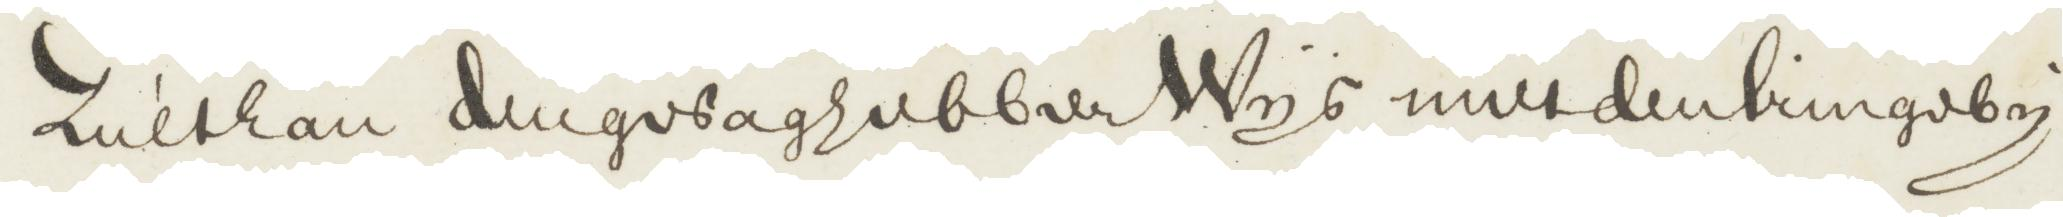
zulthan dengesaghebber Wijs met denkingebij
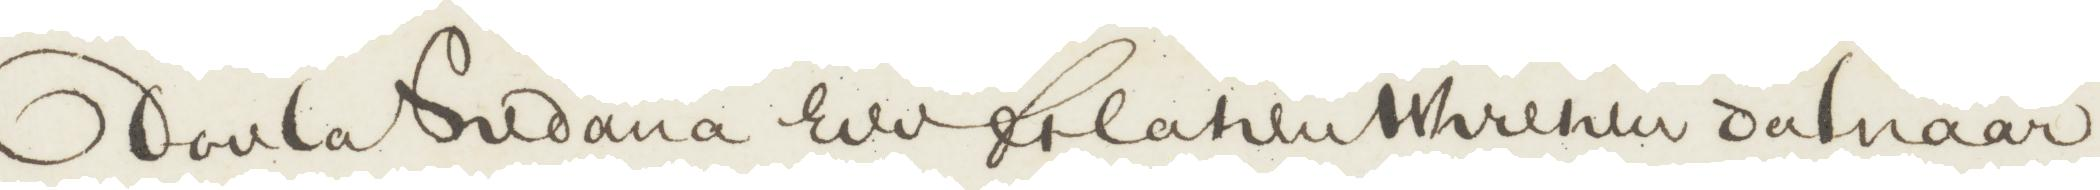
doeta Sedana heeftlatenweeten dat naar
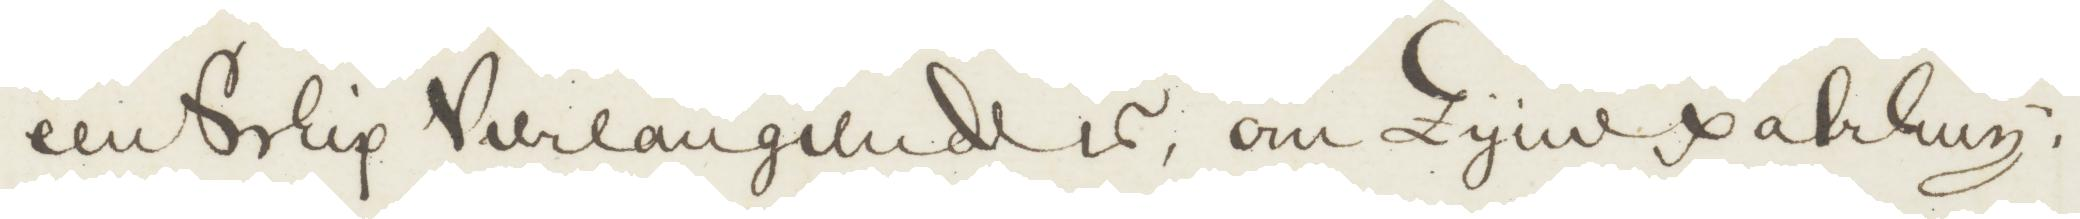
een schip verlangende is, om zijne pakhuij„
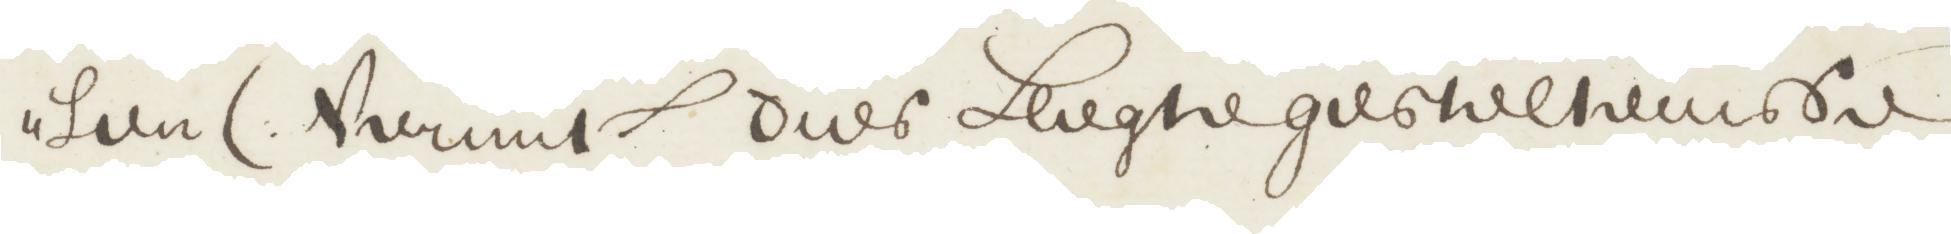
„sen (vermits dies slegte gesteltenisse
